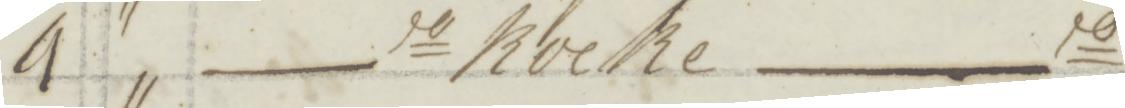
4 „ _=o Koeke _=o
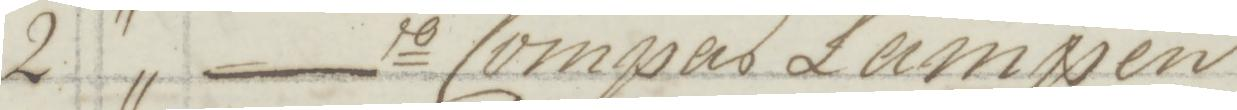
2 „ _=o Compas Lampen
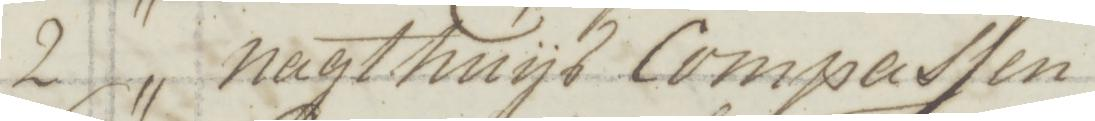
2 „ nagthuijs Compassen
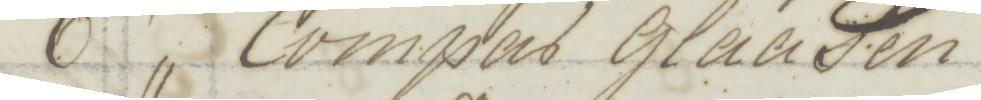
6 „ Compas glaasen
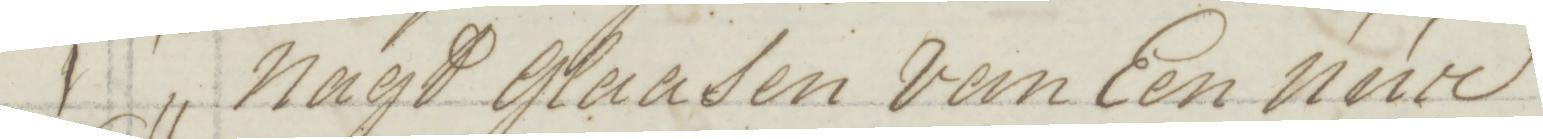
1 „ nagt glaasen van Een uur
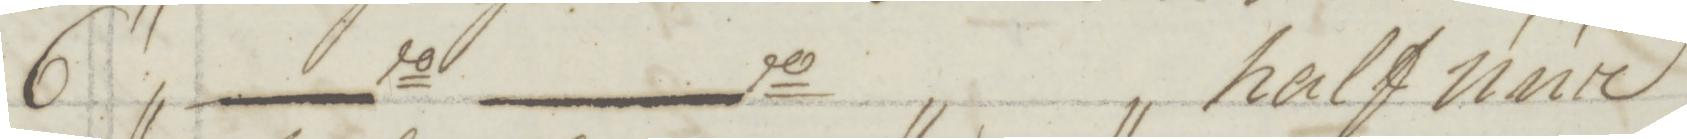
6 „ __o _=o „ „ half nur
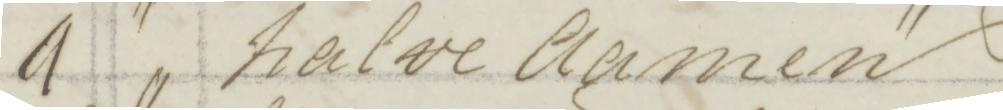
4 „ halve aamen
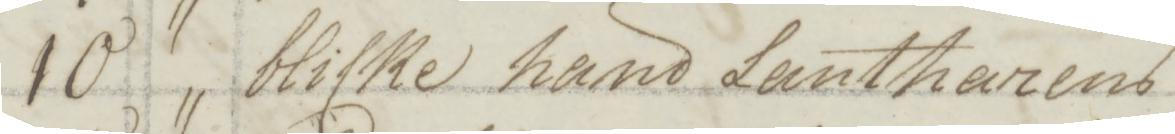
10 „ blicke hand Lantharens
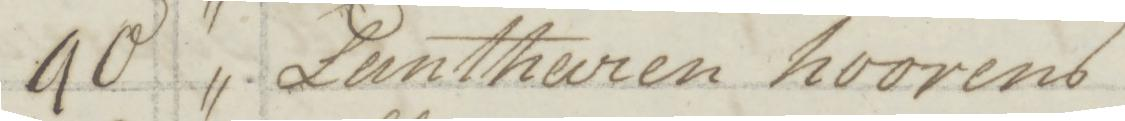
40 „ Lantharen hoovens
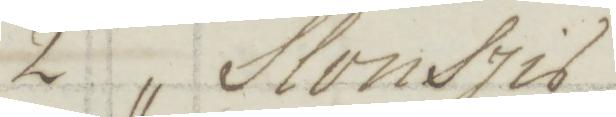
2 „ slonsjis
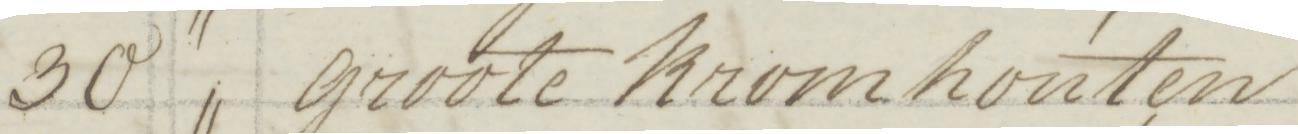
30 „ groote Kromhouten
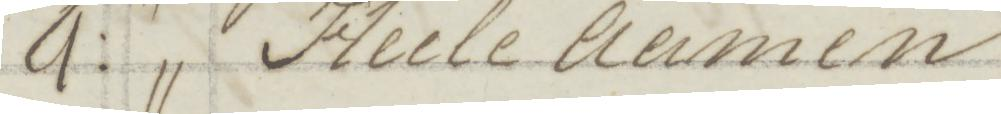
4: „ Heele Aamen
